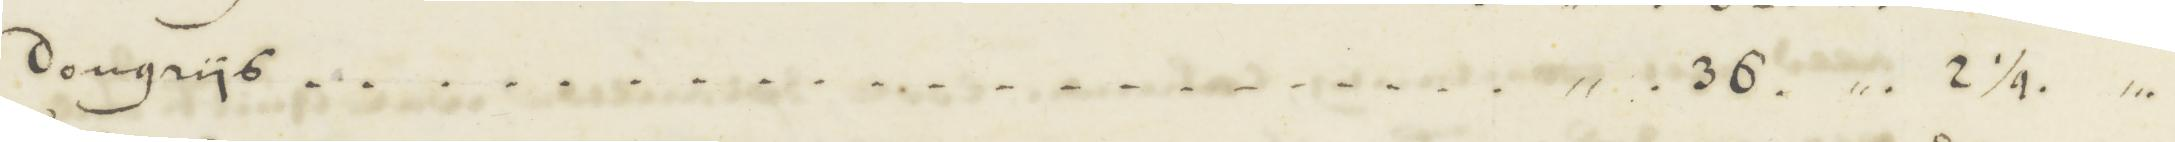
dongrijs - - - - - - - - - - - - - - - - - - - - - „ . 36. „ . 2¼. „.
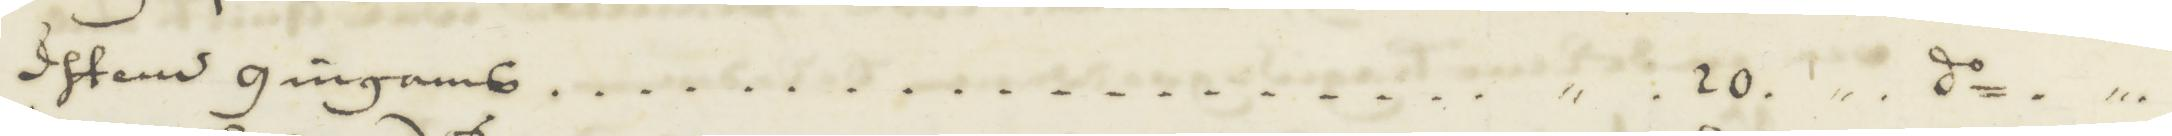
Effene gingams - - - - - - - - - - - - - - - - - - - „ . 20. „ . d=o. „.
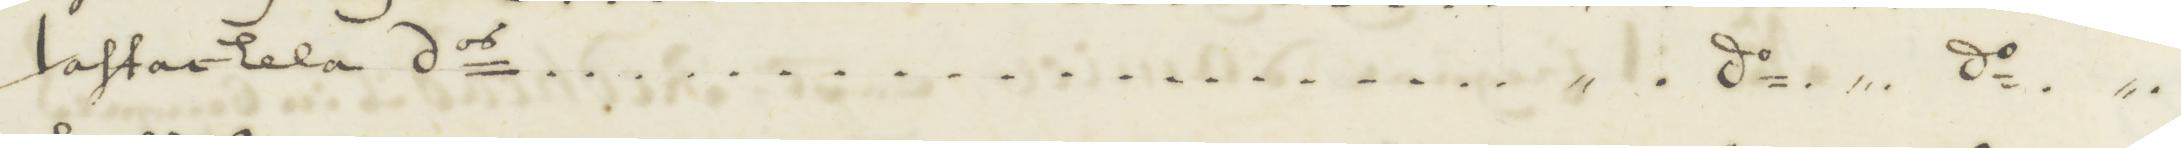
taffachela d=os - - - - - - - - - - - - - - - - - - - - „ . d=o. „ . d=o. „.
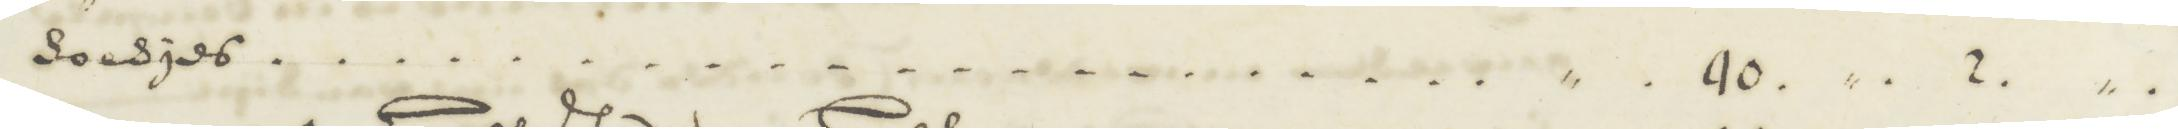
soesjes - - - - - - - - - - - - - - - - - - - - - „ . 40. „ . 2. „.
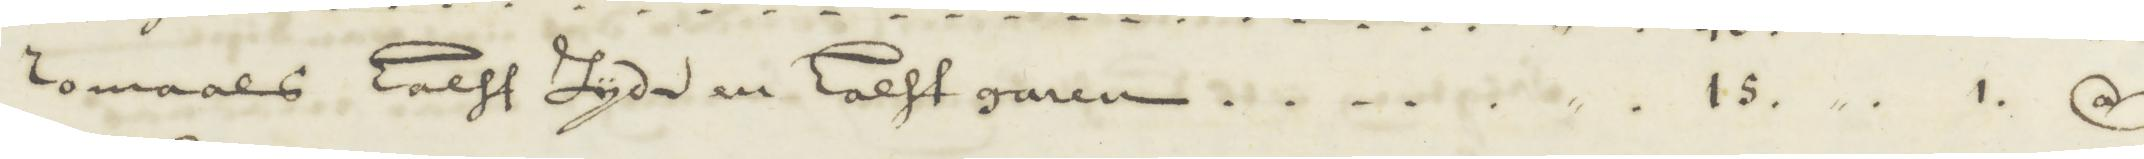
Romaals halff zijde en halff garen - - - - - „ . 15. „ . 1. @
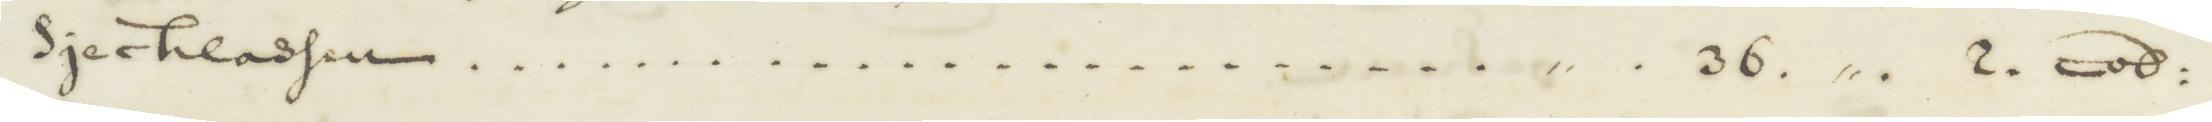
sjecklassen - - - - - - - - - - - - - - - - - - - - - - - „ . 36. „ . 2. cod:
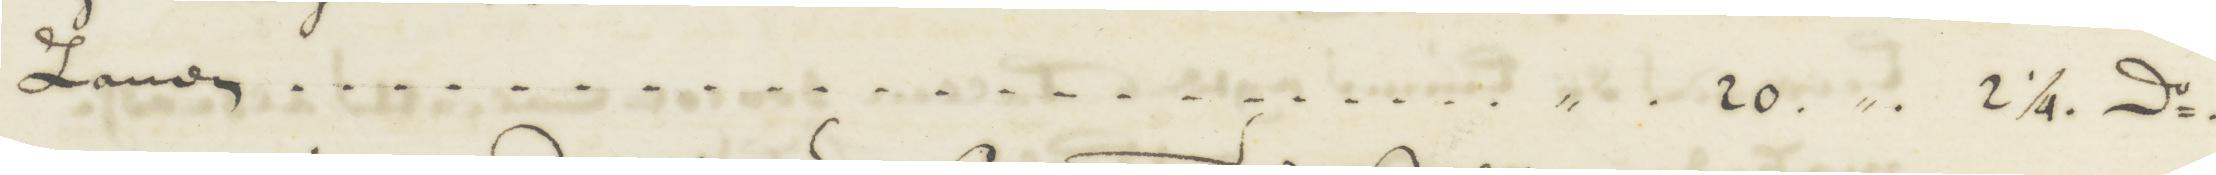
Zanen - - - - - - - - - - - - - - - - - - - - „ . 20. „ . 2¼. D=o
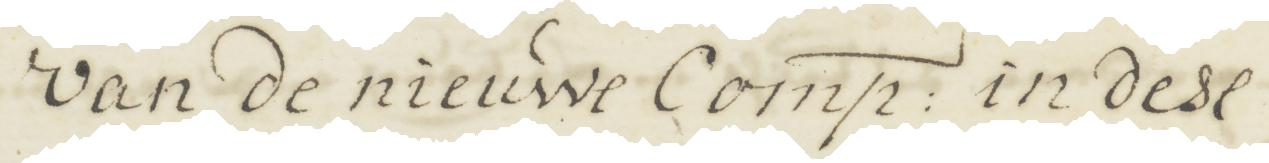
van de nieuwe Comp: in dese
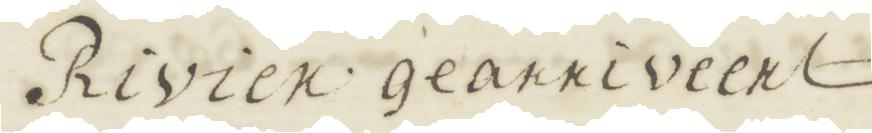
Rivier gearriveert
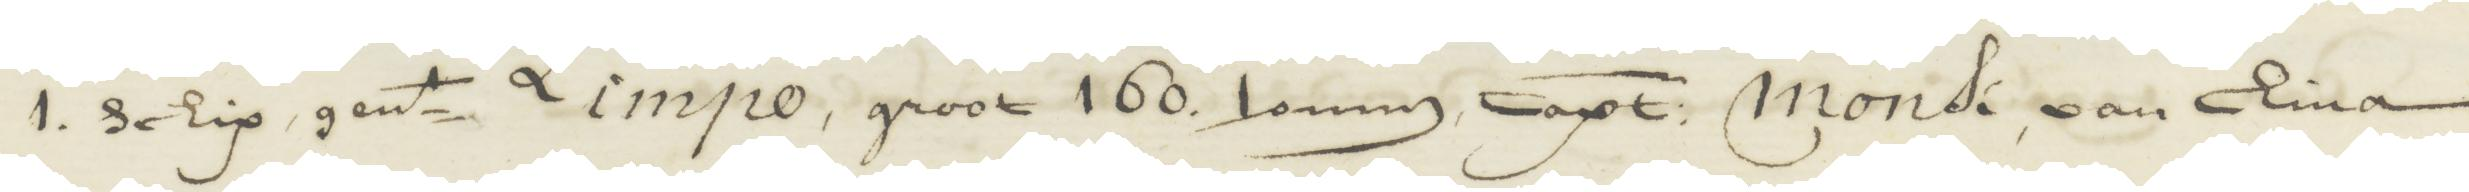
1. schip, gen=t Limpo, groot 160. tonnen, capt: Monk, van china
